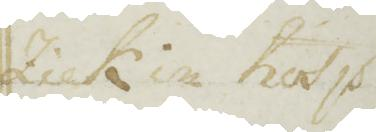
Ziek in hosp
